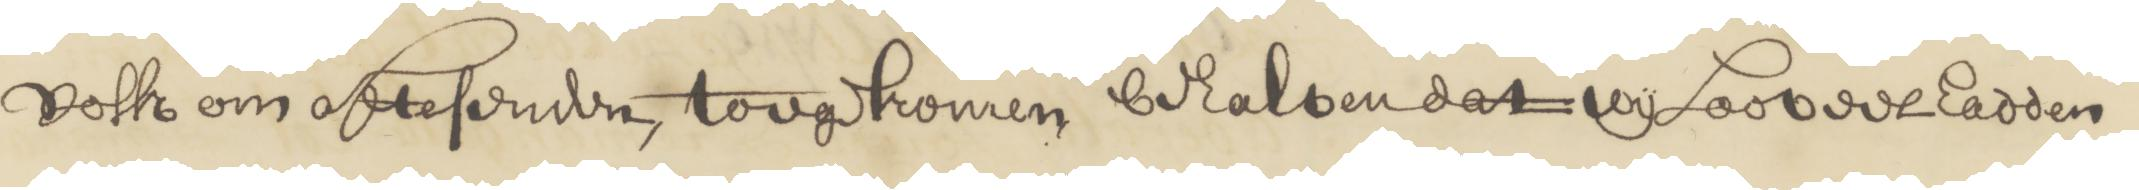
volk om aftesenden, toegekomen behalven dat wij soo veel hadden
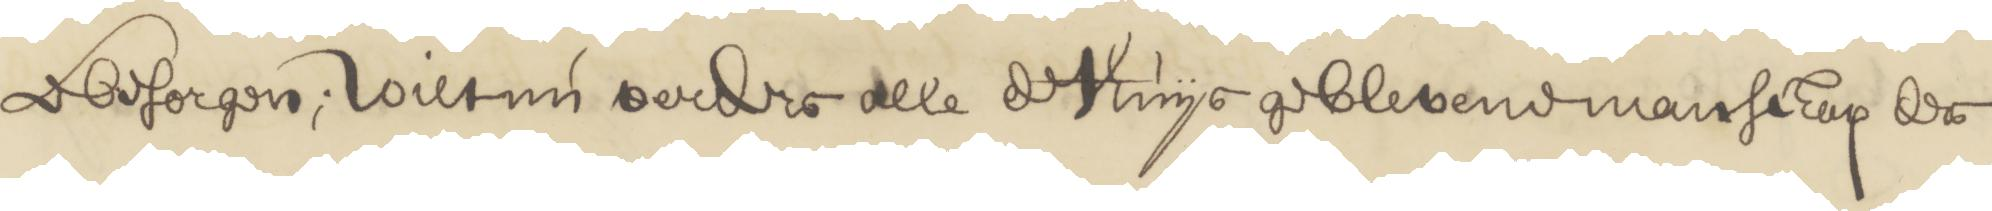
tebesorgen; wilt nu verders alle de thuijs geblevene manschap der
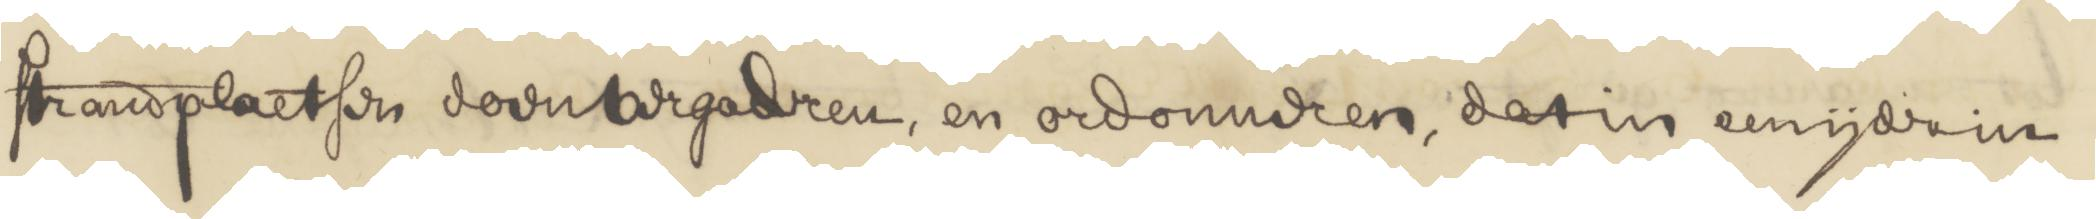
strandplaetsen doen vergaderen, en ordonneren, dat in eenijder in
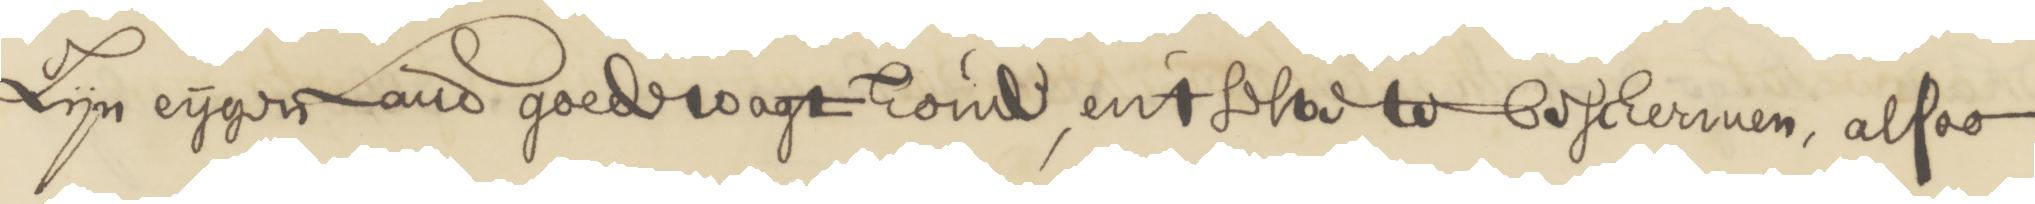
zijn eijgen Land goede wagt houde, en’t selve te beschermen, alsoo
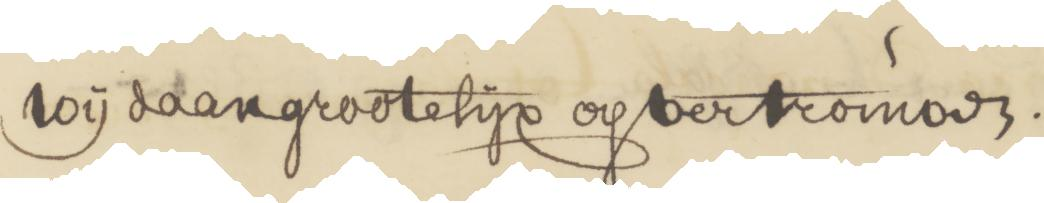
wij daar grootelijx op vertrouwen. —
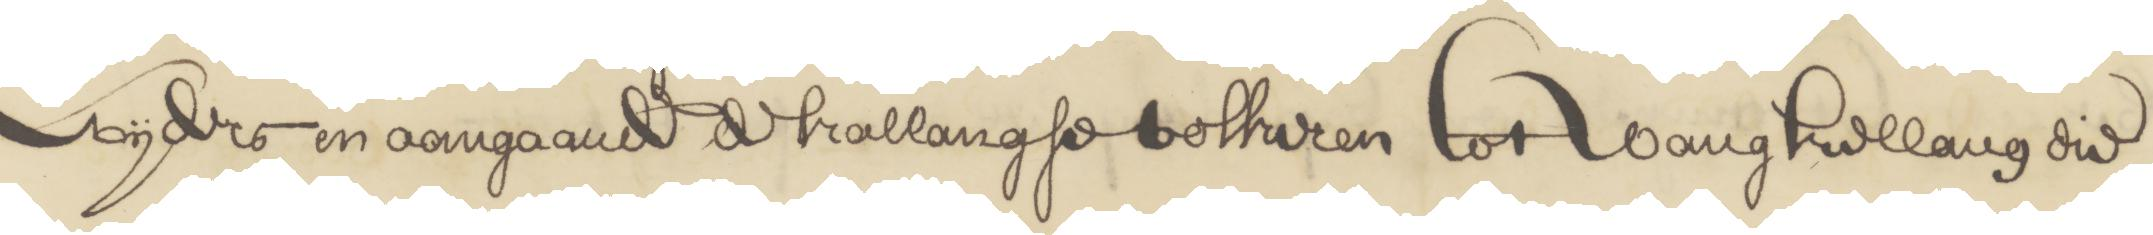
wijders en aangaande de kallangse volkeren tot wangkellang die
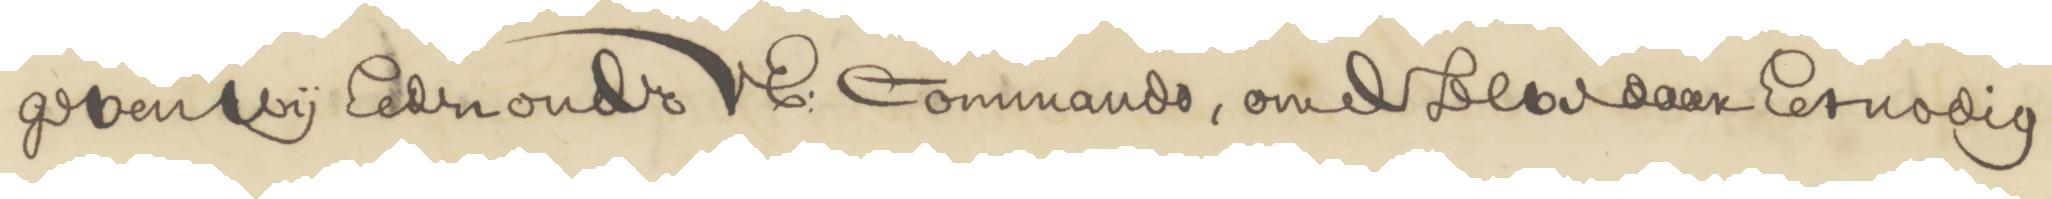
geven wij heden onder VE: commando, om deselve daar het nodig
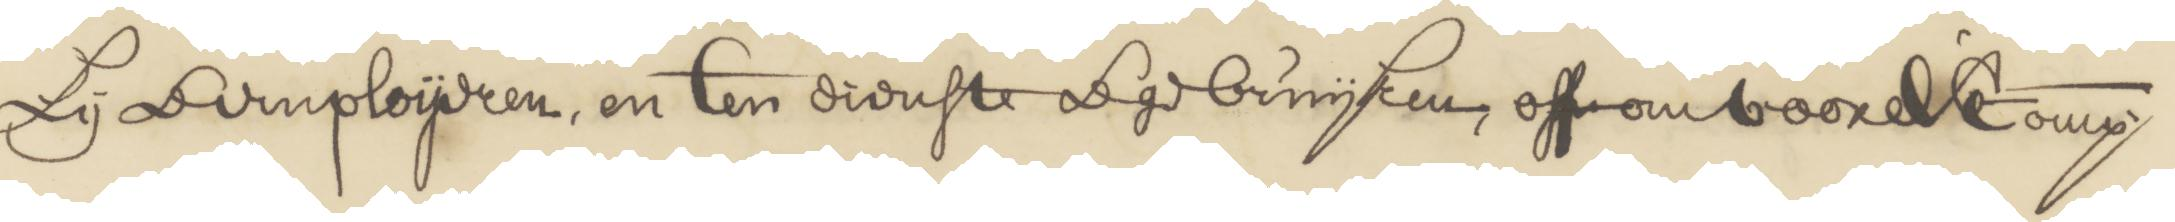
zij te emploijeren, en ten dienste te gebruijken, off om voor d'Ecomp:
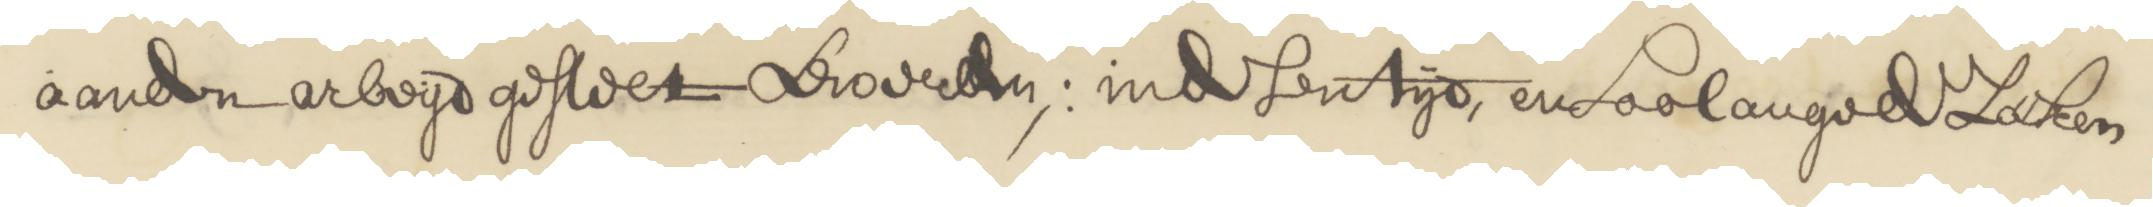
aanden arbeijd gestelt tewerden, : indesentijd, en soolange de zaeken
